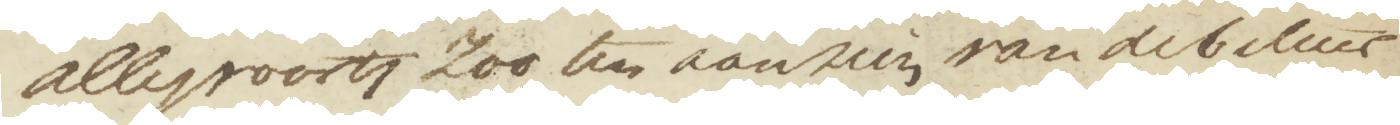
allesvoorts zoo ten aanzien van debiteur
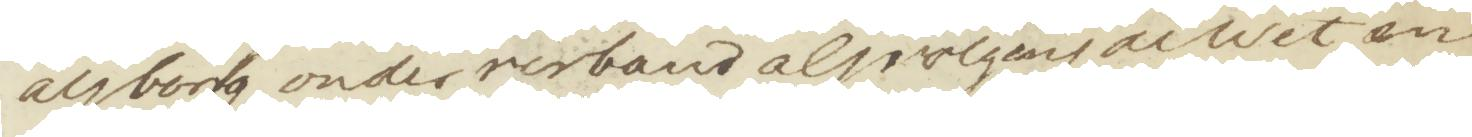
als borg onder verband als volgens de wet en
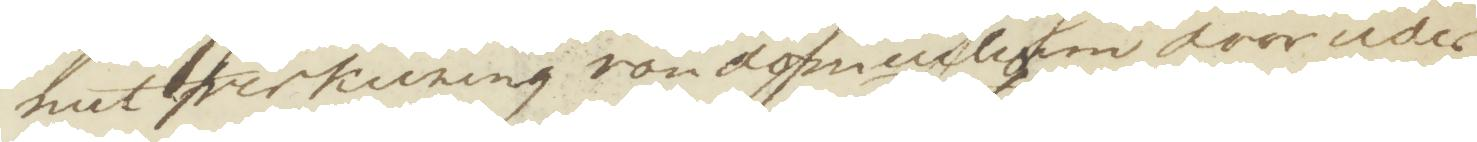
met verkiezing van domicilium door ieder
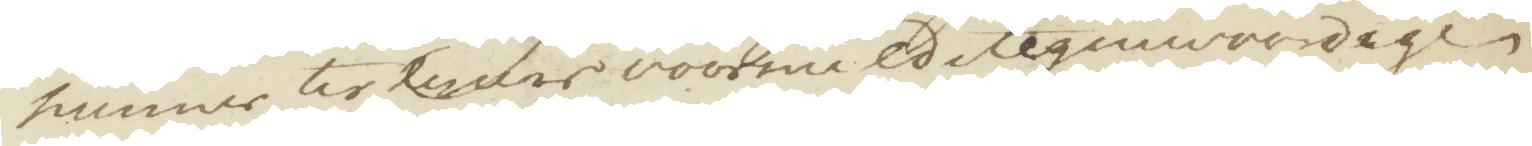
hunner ter zyner voormelde tegenwoordigen
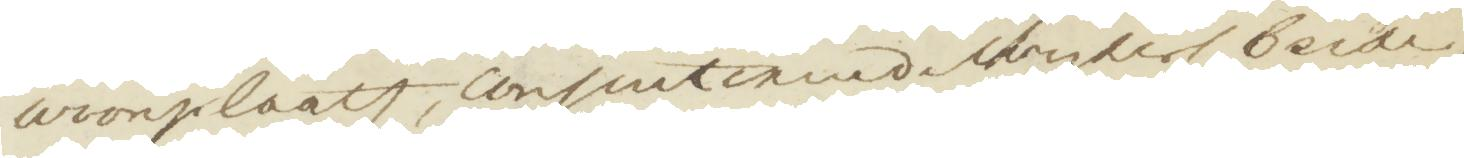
woonplaats, consenterende wyders beide
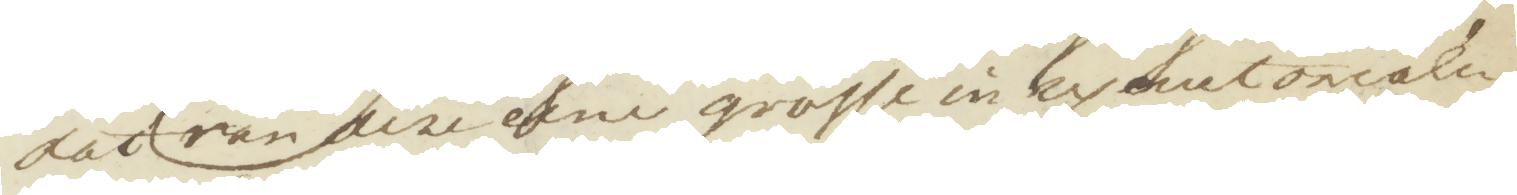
dat van deze eene grosse in executorialen
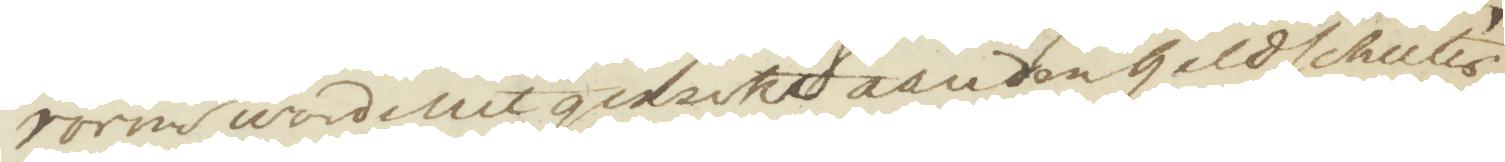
vorm worde uit gereikt aan den Geldschieter
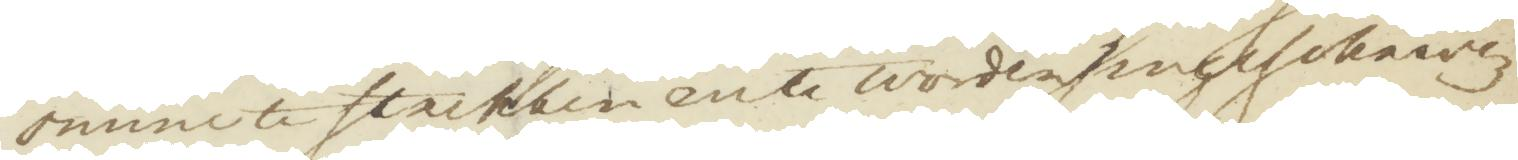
omme te strikken en te worden ingeschreven
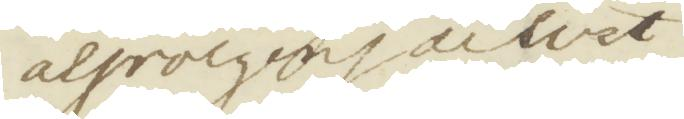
alsvolgens de wet
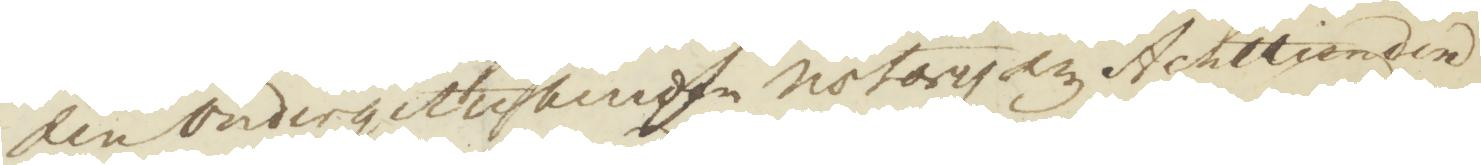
den ondergeteekenden notaris den Achttienden
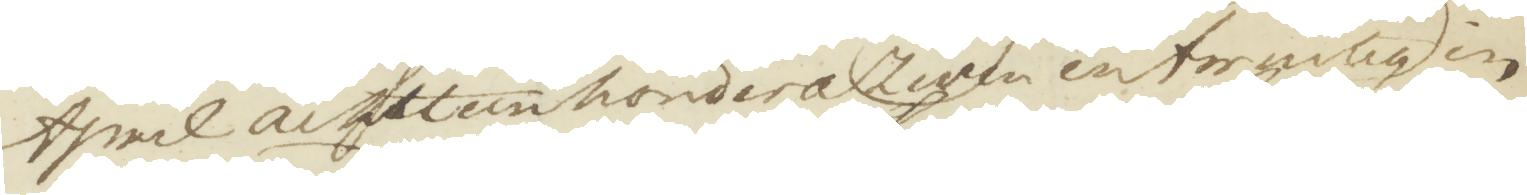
April achttienhonderd zeven en twintig in
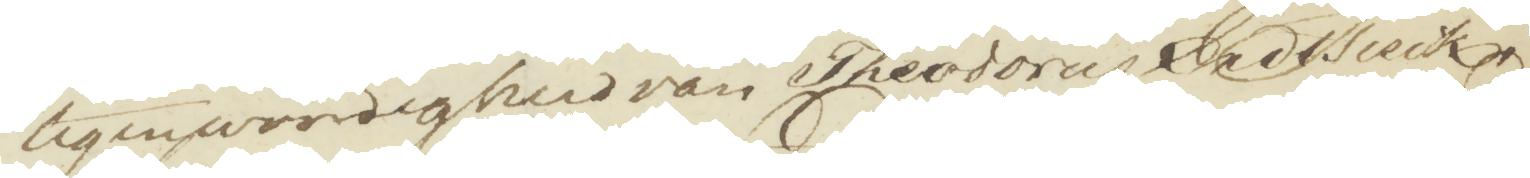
tegenwoodigheid van Theodorus Erdtsieck
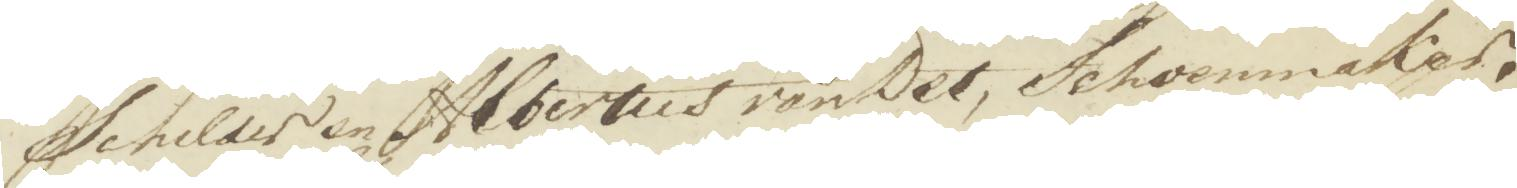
Schilder en Albertus van Det, Schoenmaker,
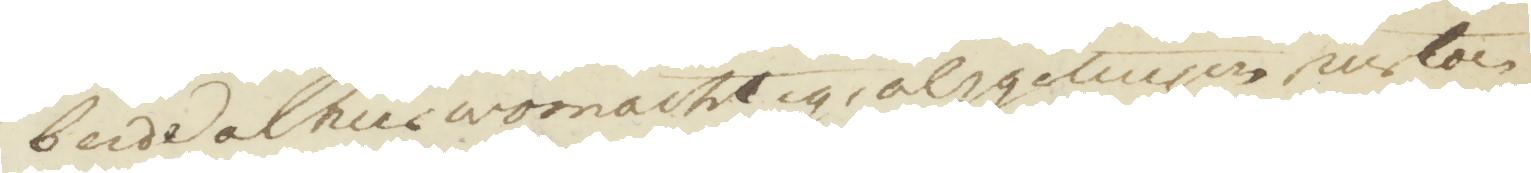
beide alhier woonachtig, als getuigen hiertoe
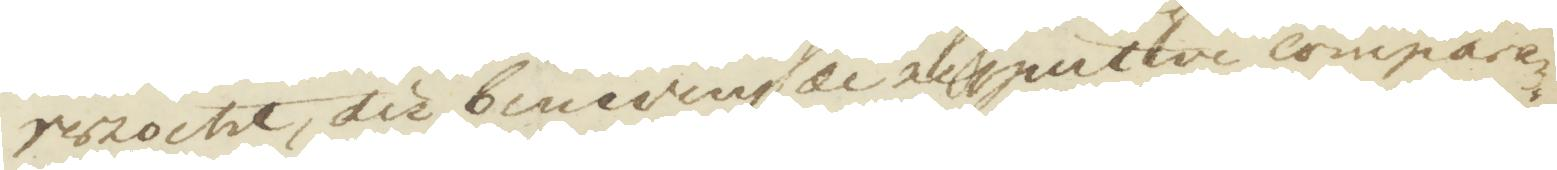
verzocht, die benevens de respective comparan„
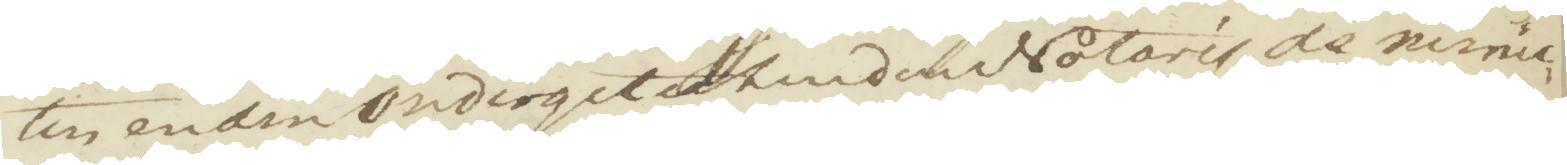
ten en den ondergeteekenden Notaris de minu„
